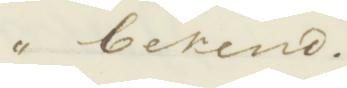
„ bekend.
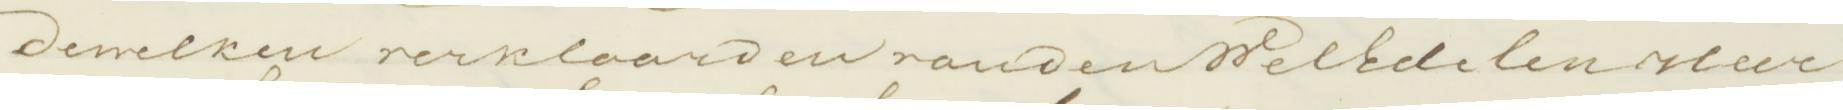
dewelken verklaarden van den WelEdelen Heer
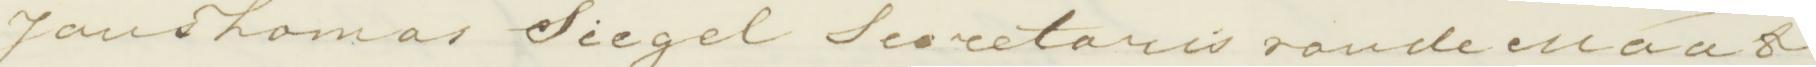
Jan Thomas Siegel Secretaris vande Maat
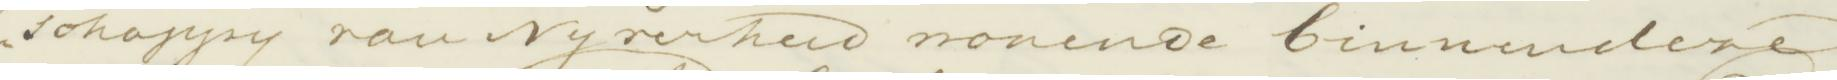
„schappy van Nyverheid wonende binnen deze
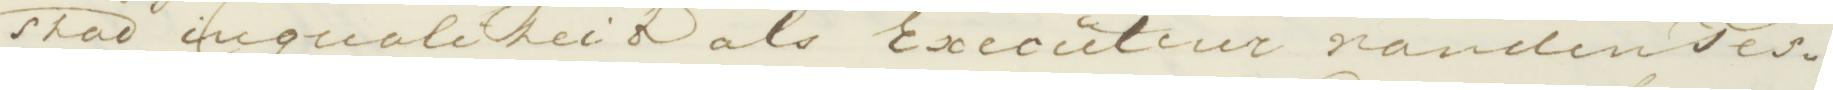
stad inqualiteit als Executeur vanden Tes„
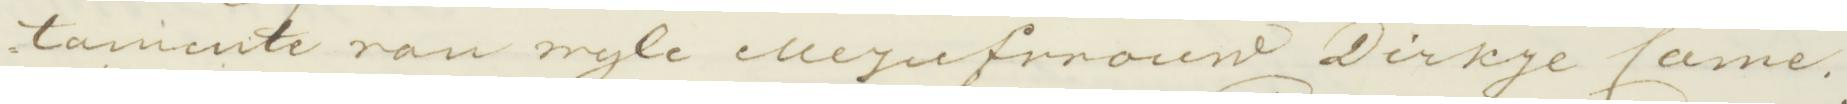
„tamente van wyle Mejufvrouw Dirkje Came,
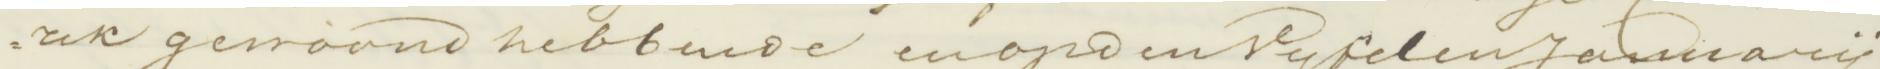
„rik gewoond hebbende en op den Vyfden Januarij
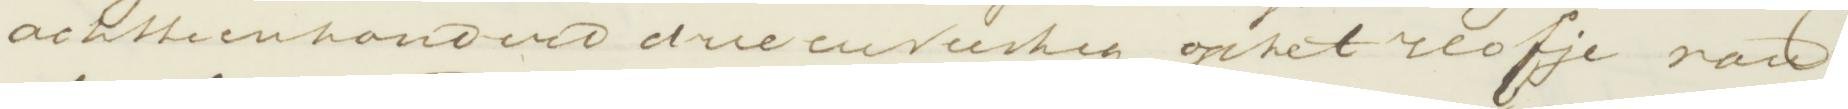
achttienhonderd drie en veertig op het Hofje van
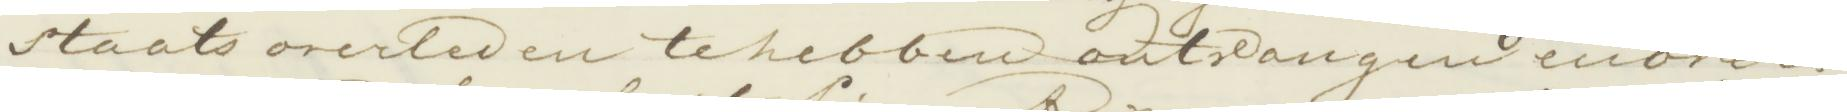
staats overleden tehebben ontvangen en over.
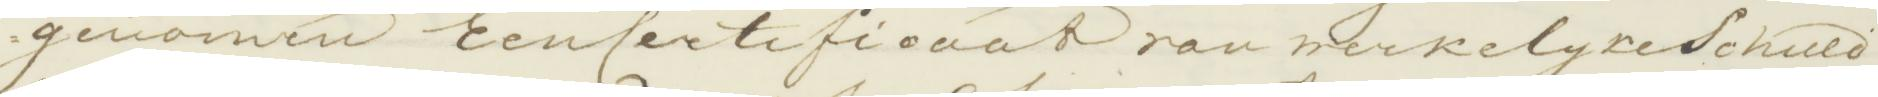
„genomen Een Certificaat van werkelyke schuld
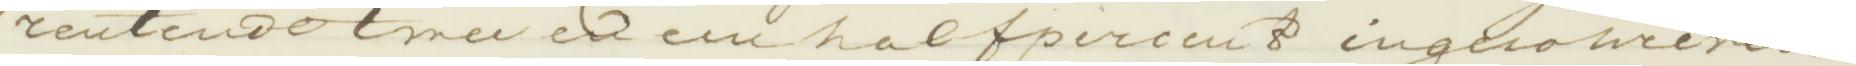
rentende twee en een halfpercent ingeschreven
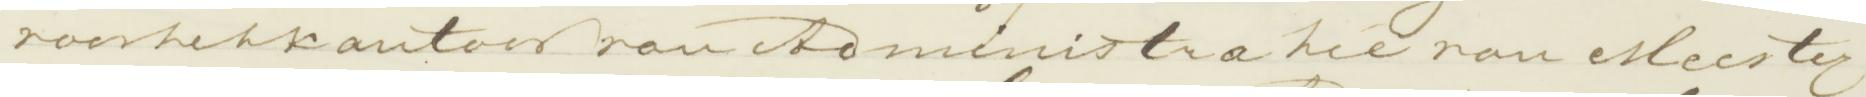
voorhetkantoor van Administratie van Meester
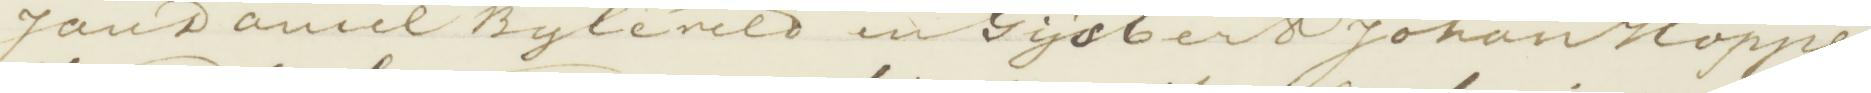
Jan Daniel Byleveld en Gijsbert Johan Hoppe
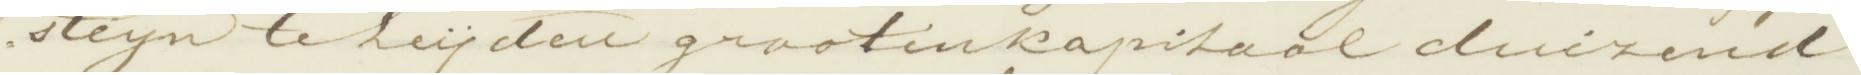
„steyn te Leijden grootinkapitaal duizend
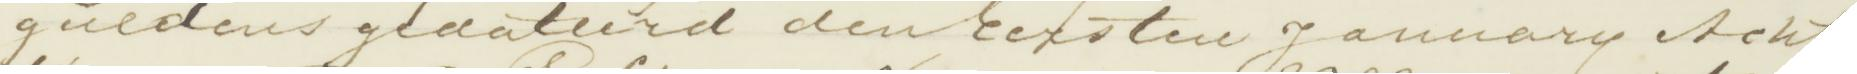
guldens gedateerd den Eersten January Acht
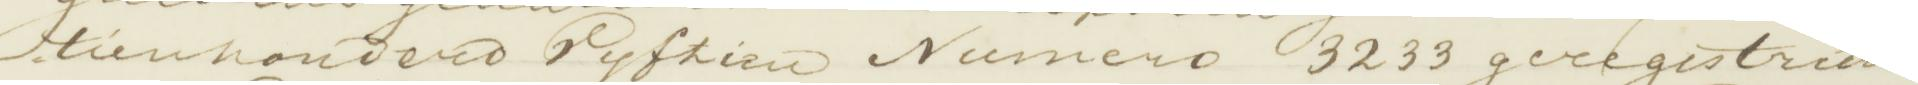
„tienhonderd Vyftien Numero 3233 geregistreerd
